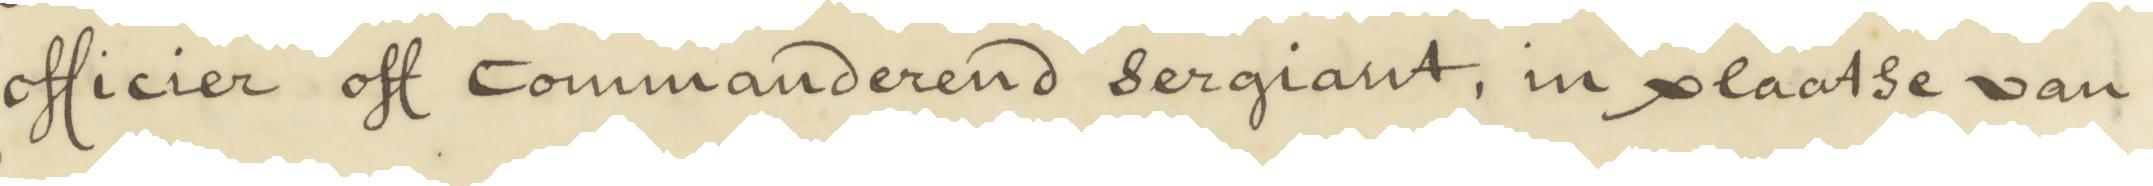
officier off commanderend sergiant, in plaatse van
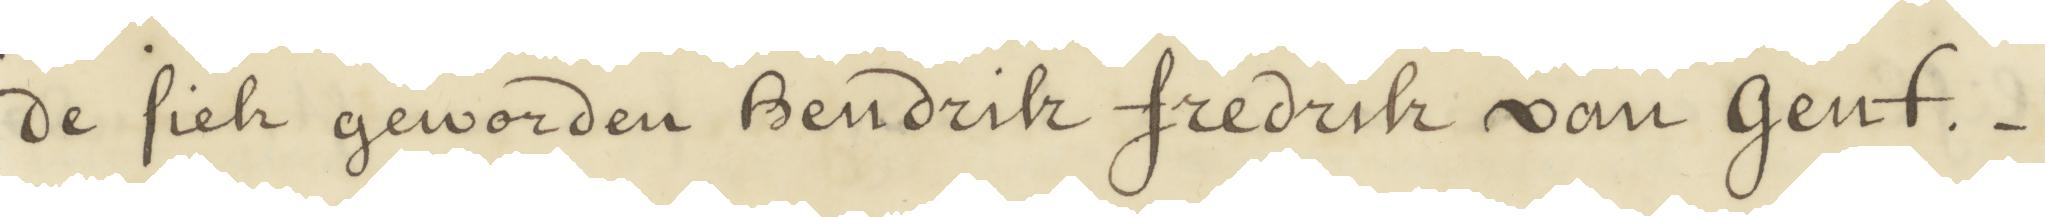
de siek geworden hendrik fredrik van Gent.-
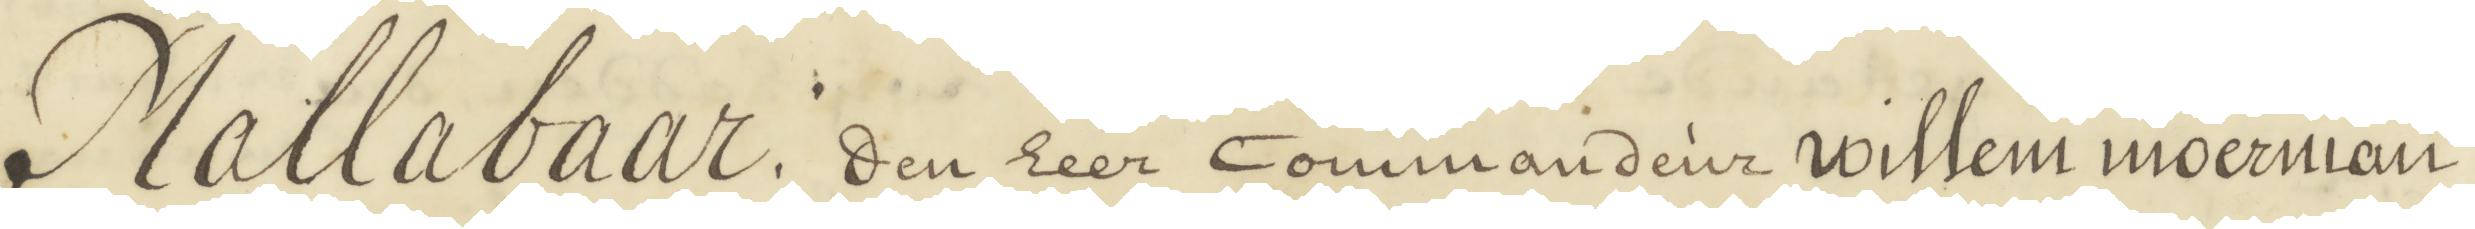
Mallabaar, den heer commandeur willem moerman
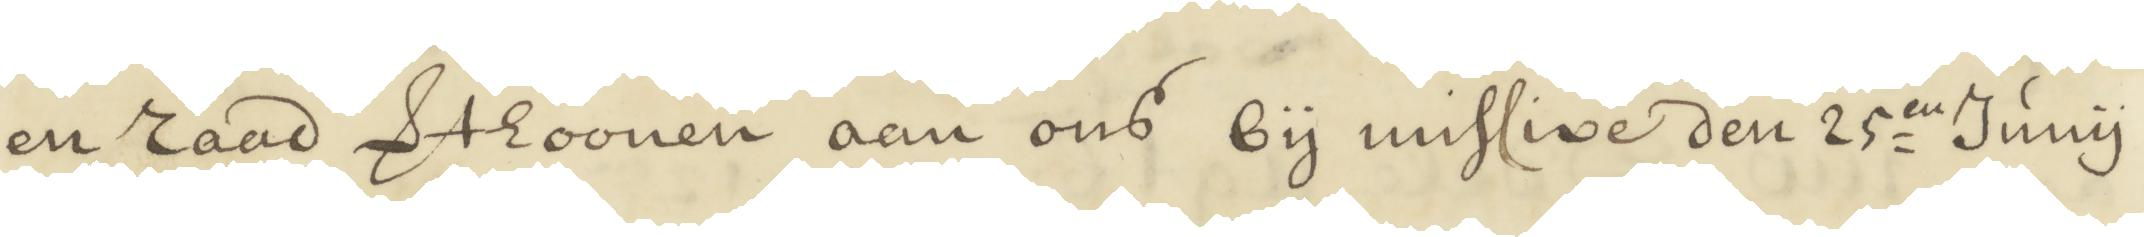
en raad verthoonen aan ons bij missive den 25=en Iunij
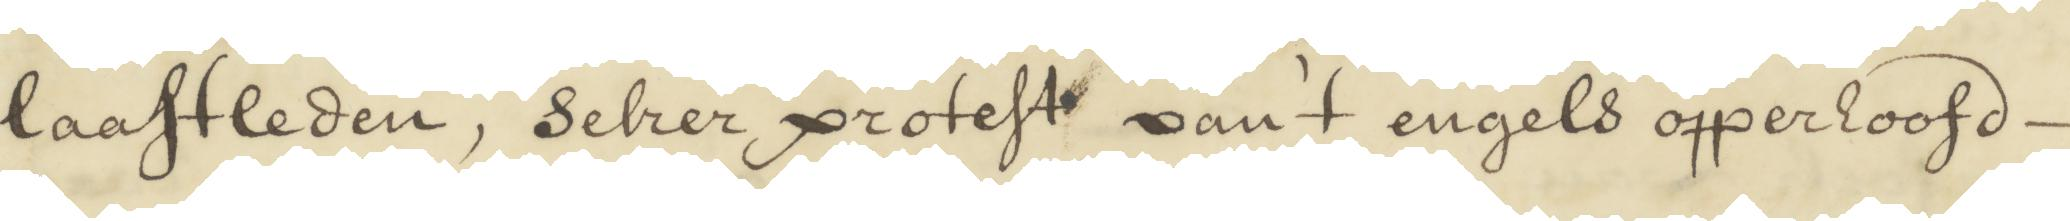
laastleden, seker protest van ’t engels opperhoofd
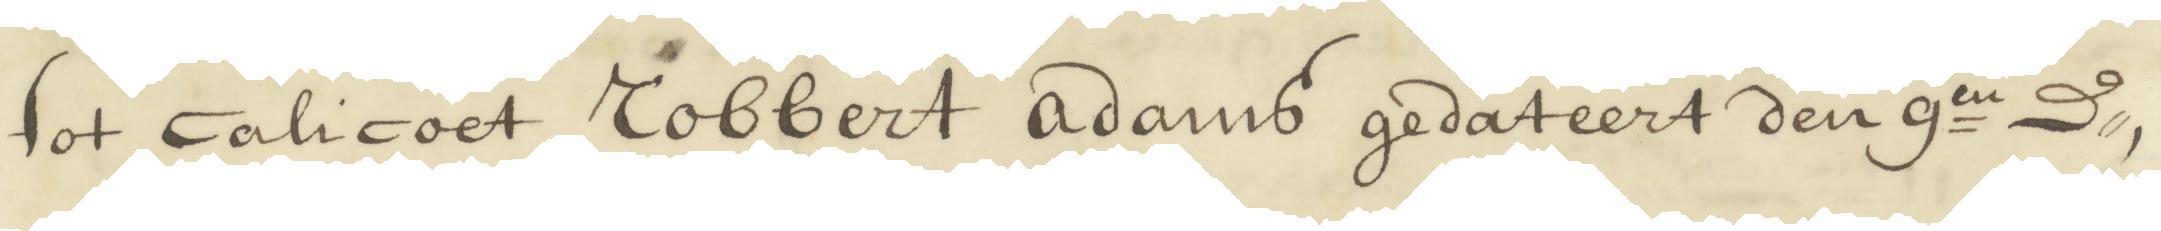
tot calicoet Robbert adams gedateert den 9=en D„o,
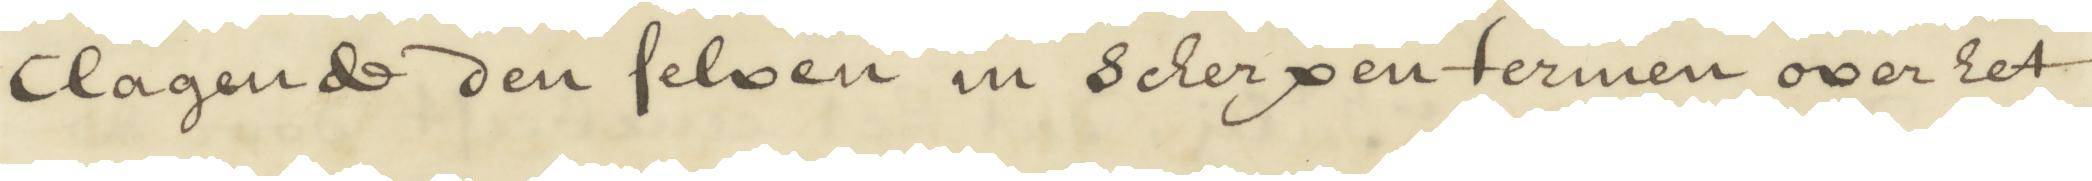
clagende den selven in scherpen termen over het
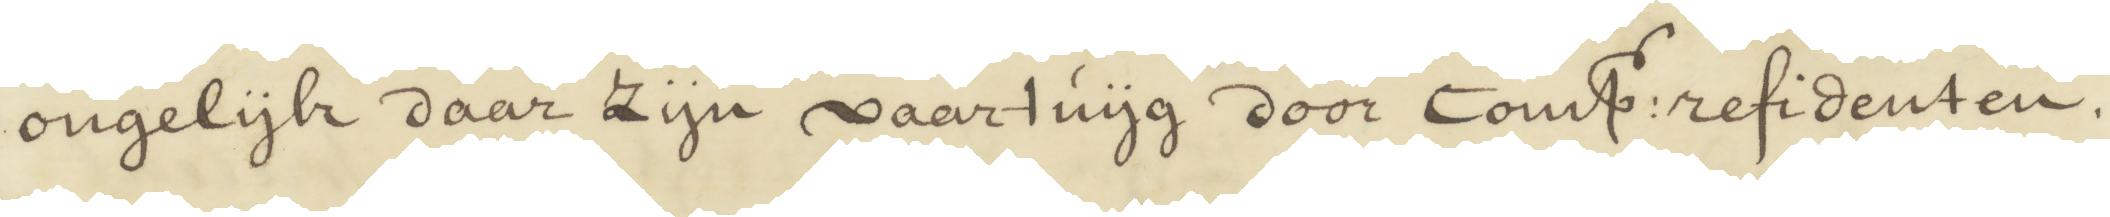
ongelijk daar zijn vaartuijg door comp:s residenten.
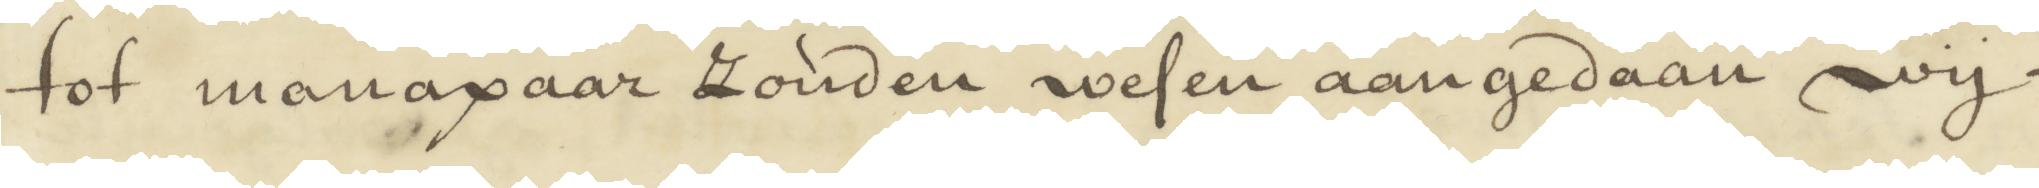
tot manapaar zouden wesen aan gedaan wij
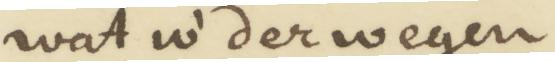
wat w' der wegen
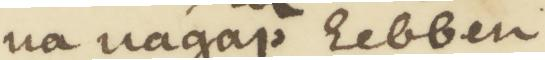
na nagap:m hebben
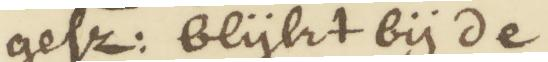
gesz: blijkt bij de
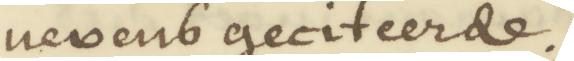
nevens geciteerde.
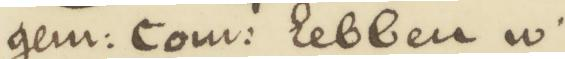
gem: com:t hebben w'
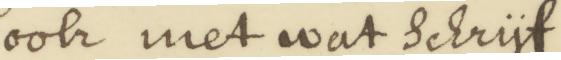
ook met wat schrijf
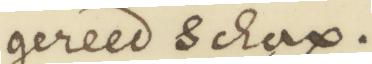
gereed schap.
